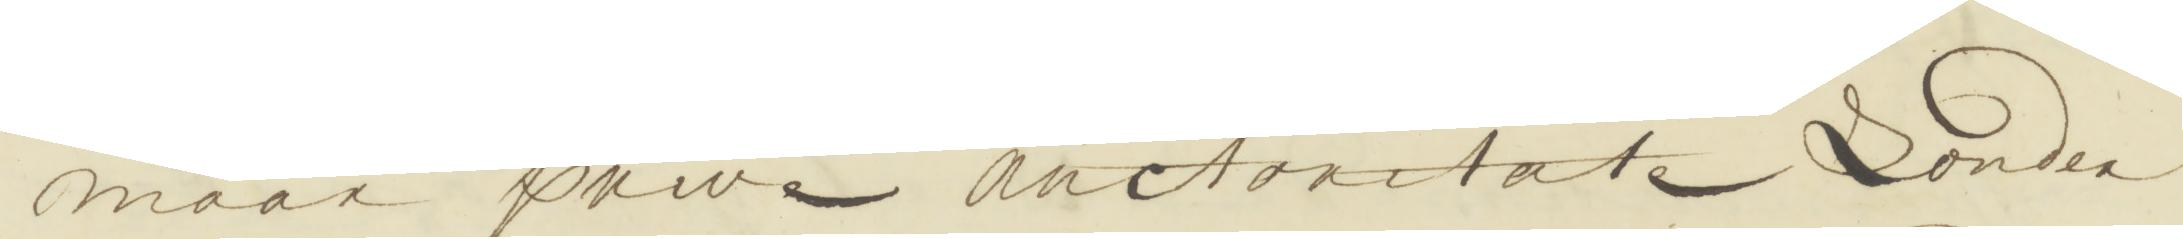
maar prive auctoritate zonder
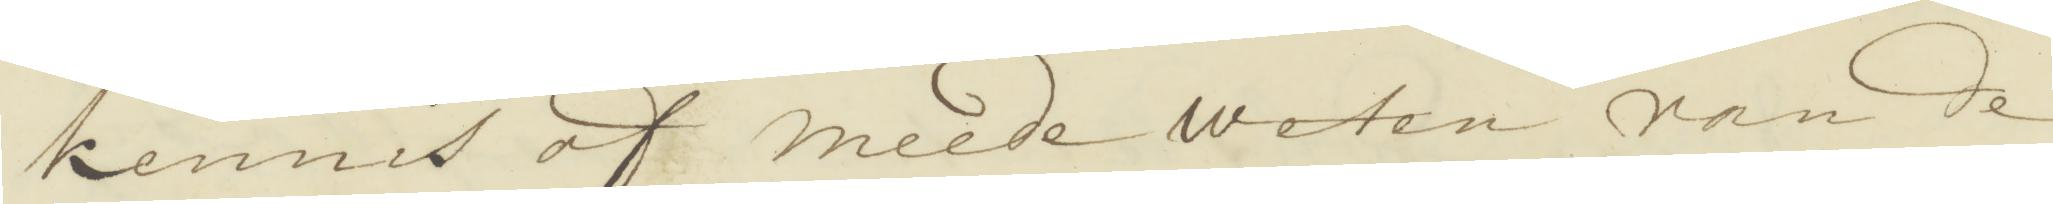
kennis of meede weten van de
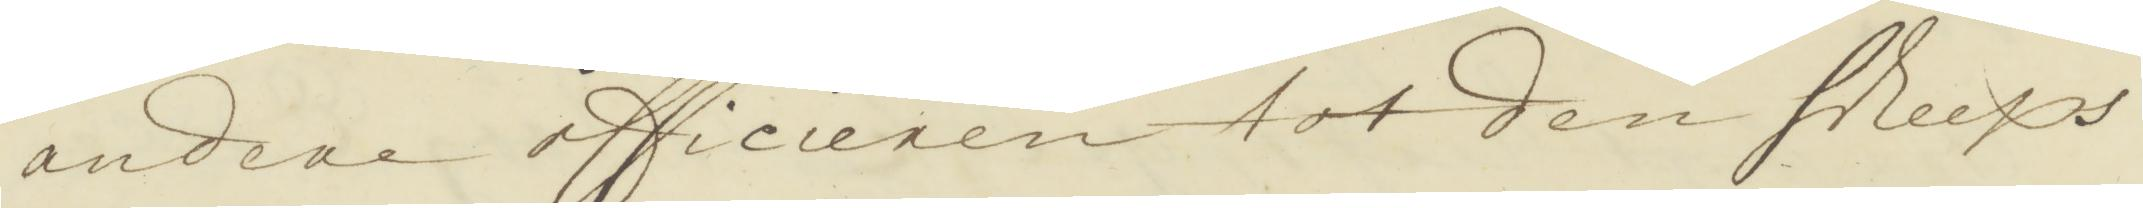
andere officieren tot den scheeps
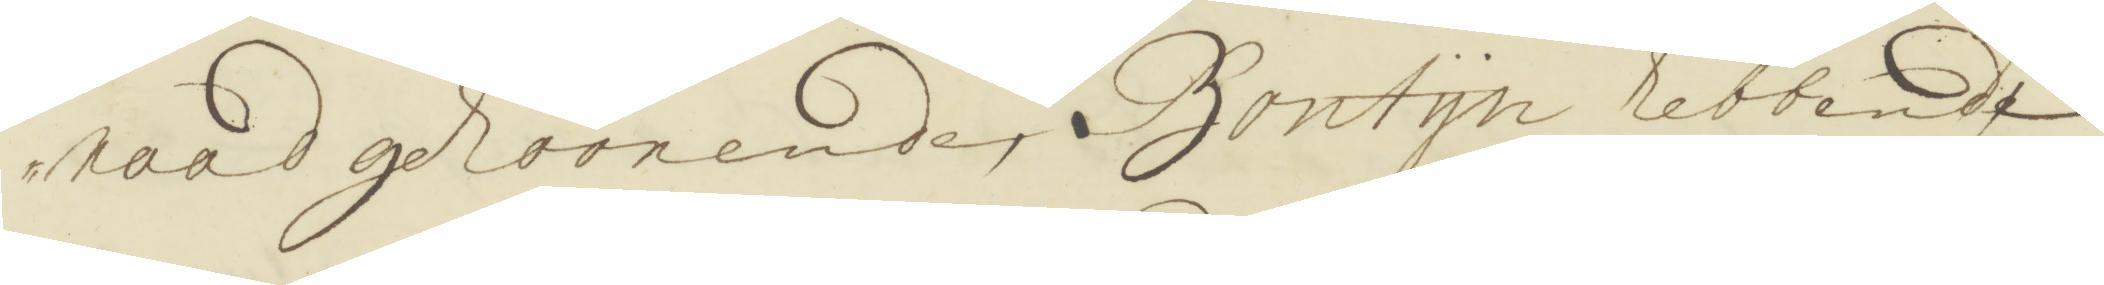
„raad gehoorende, Bontijn hebbende
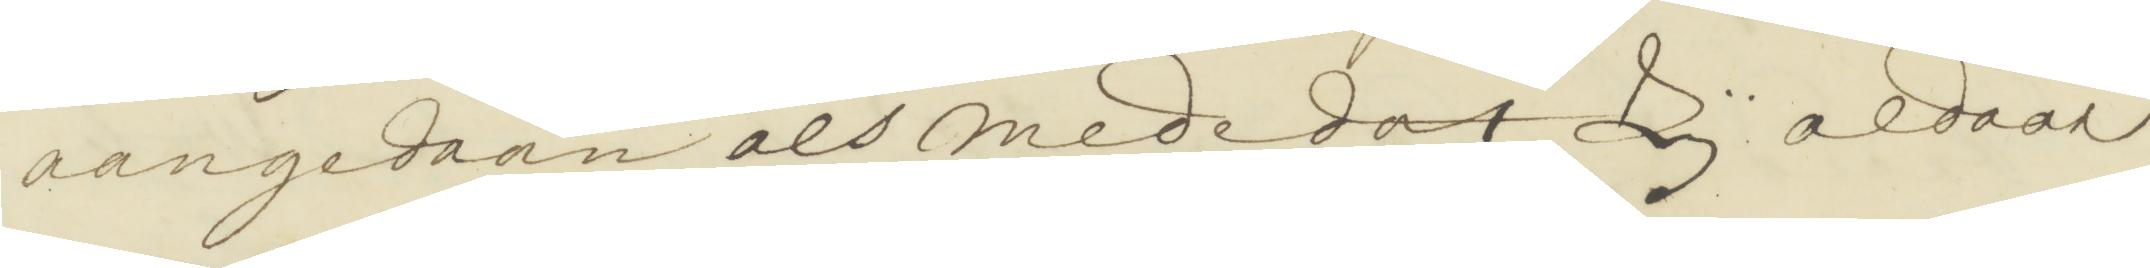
aangedaan als mede dat zij aldaar
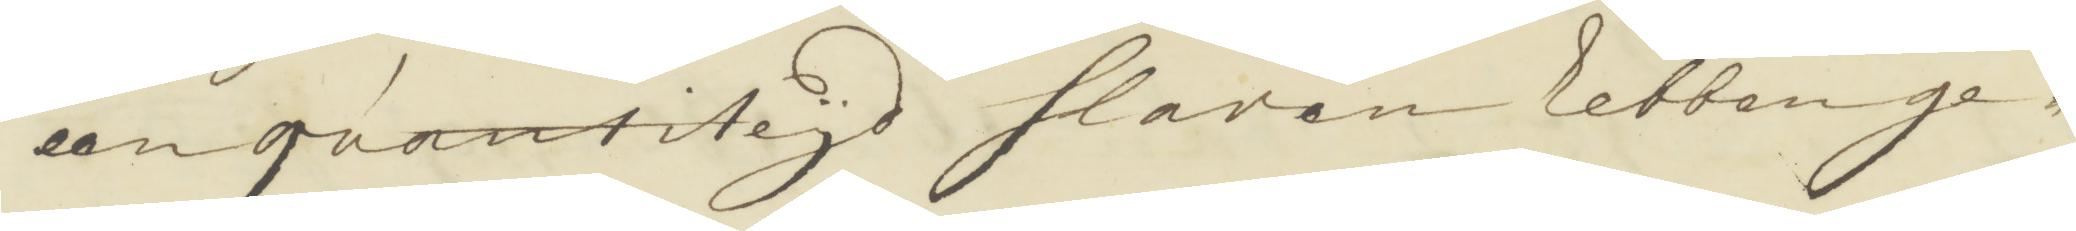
een quantiteijd slaven hebben ge„
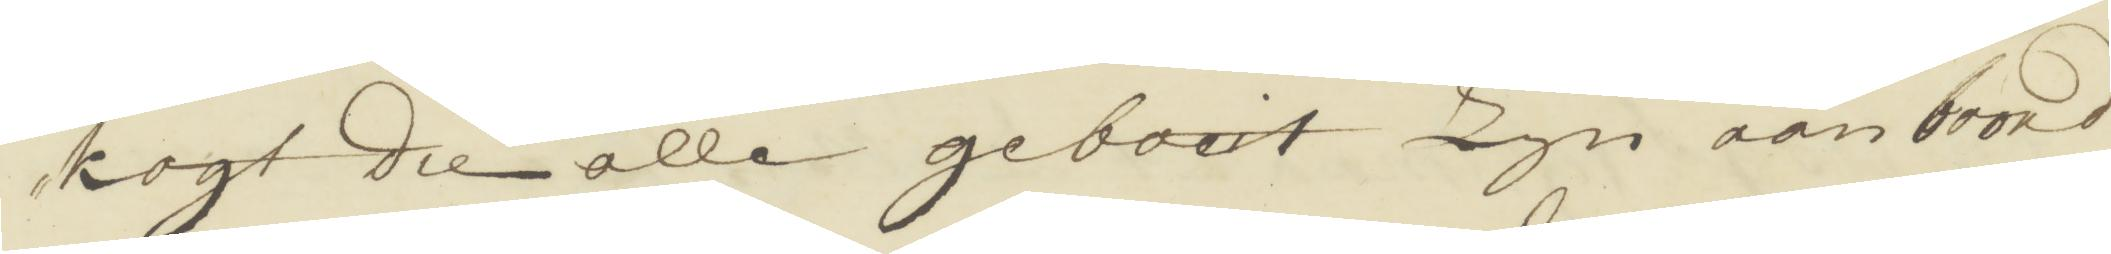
„kogt die alle geboeit zijn aan boord
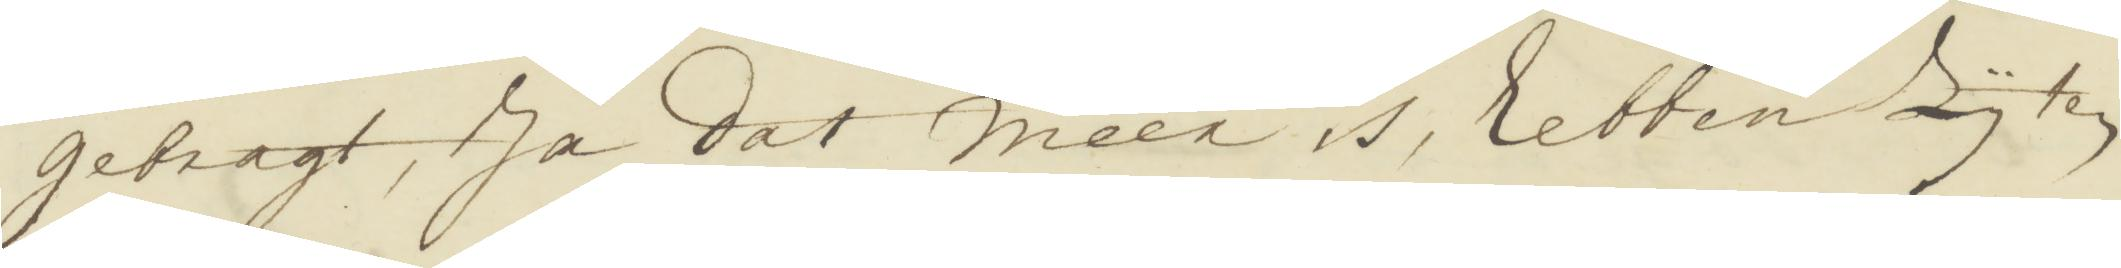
gebragt, ja dat meer is, hebben zij ten
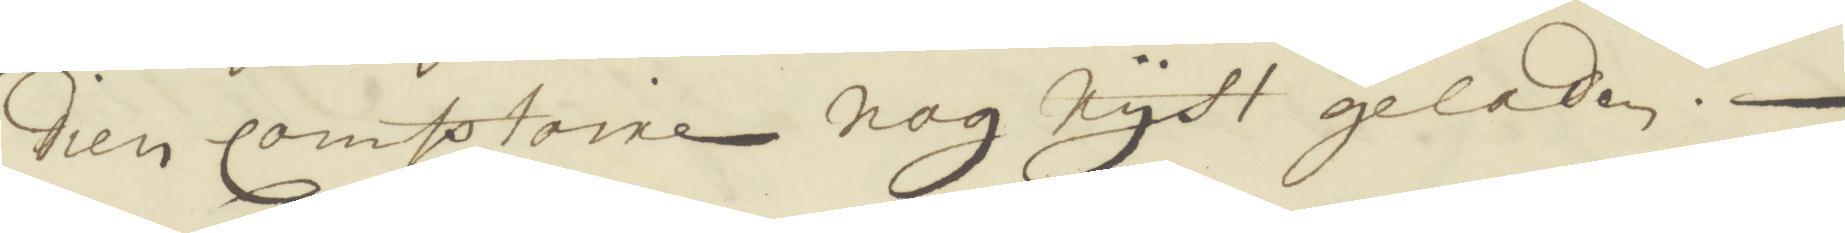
dien comptoire nog rijst geladen. —
